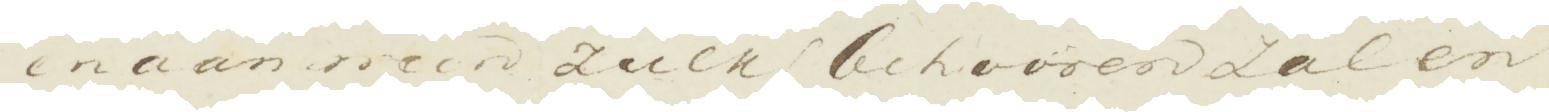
er aan wien zulks behooren zal en
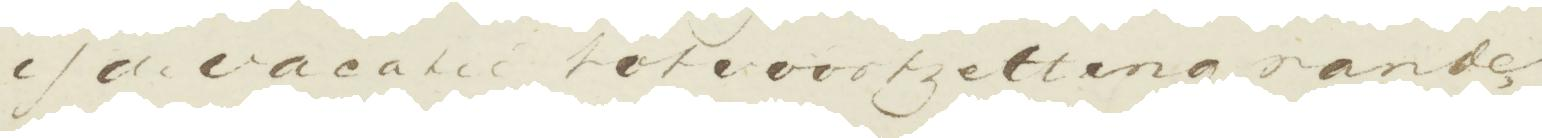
is de vacatie tot voortzetting van de,
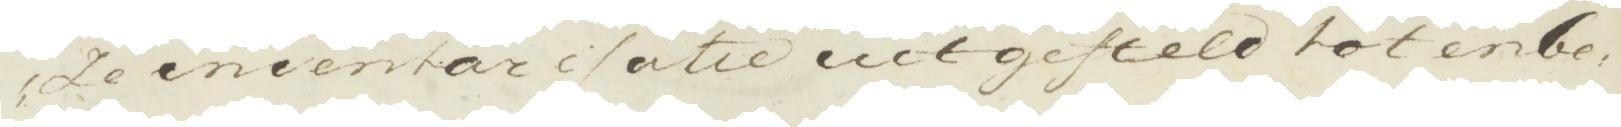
„ze inventarisatie uitgesteld tot en be„
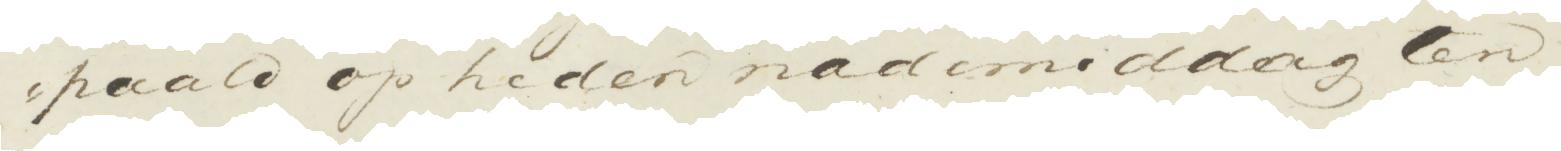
„paald op heden nademiddag ten
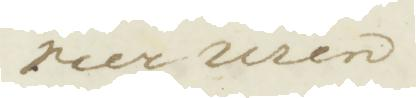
vier uren
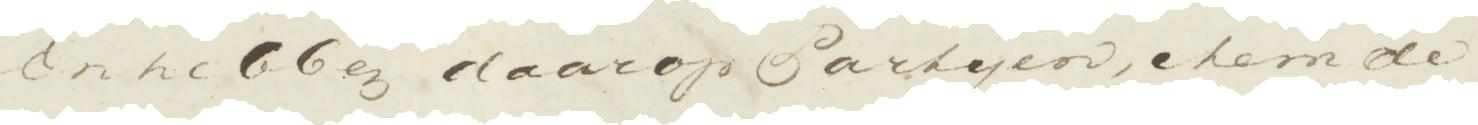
En hebben daarop Partyen, item de
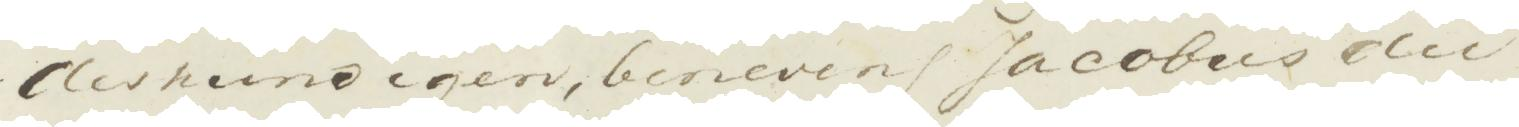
deskundigen, benevens Jacobus du
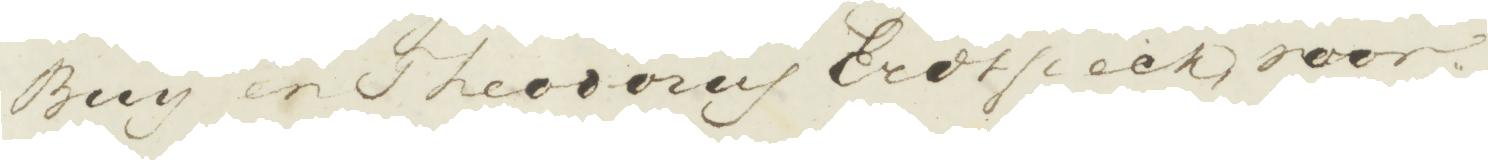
Buy en Theodorus Erdtsieck voor„
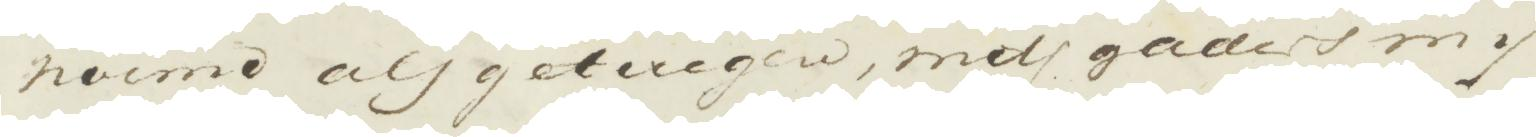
noemd als getuigen, mitsgaders my
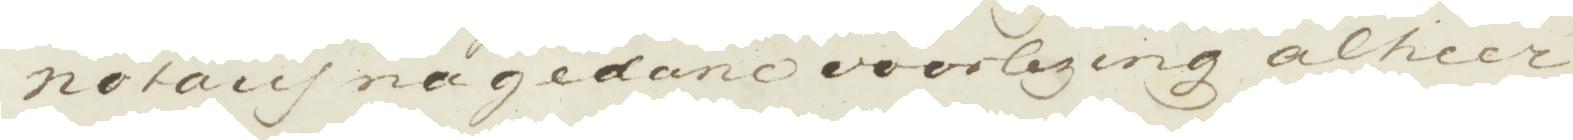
notaris na gedane voorlezing alhier
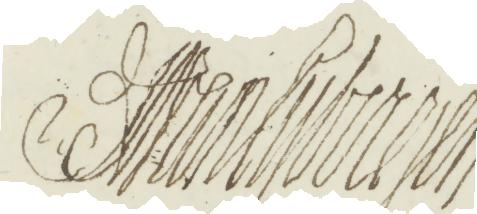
santbergen
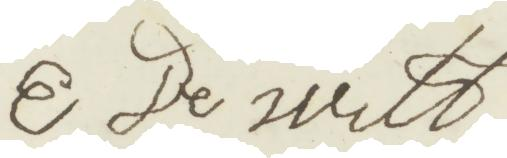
E De wilt
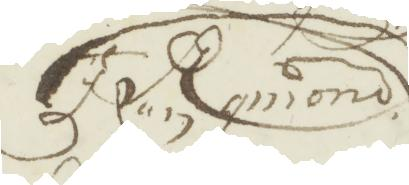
T van Egmond
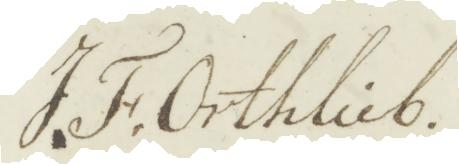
I: F: Orthlieb.
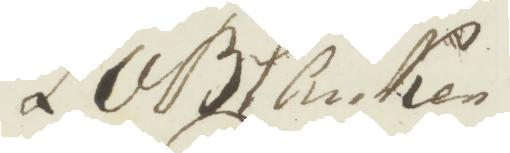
LvBlanken
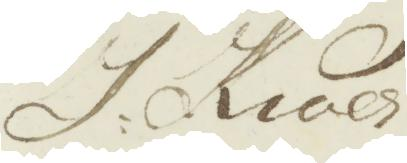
I. Kroes
